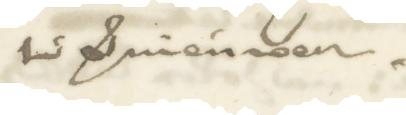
te vernieuwen
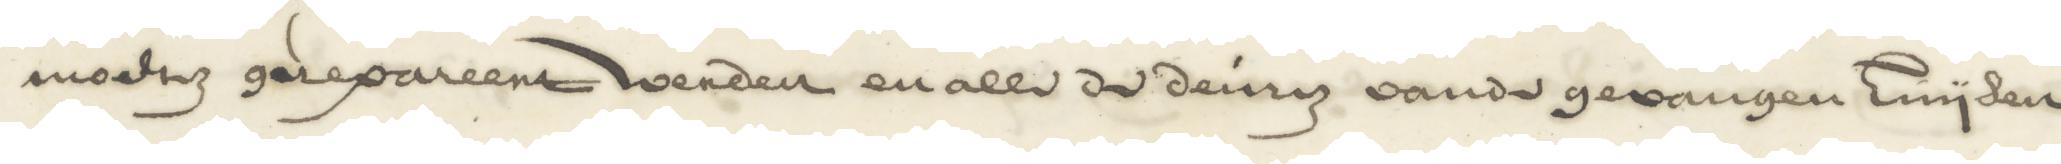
moeten gerepareert werden en alle de deuren vande gevangen huijsen
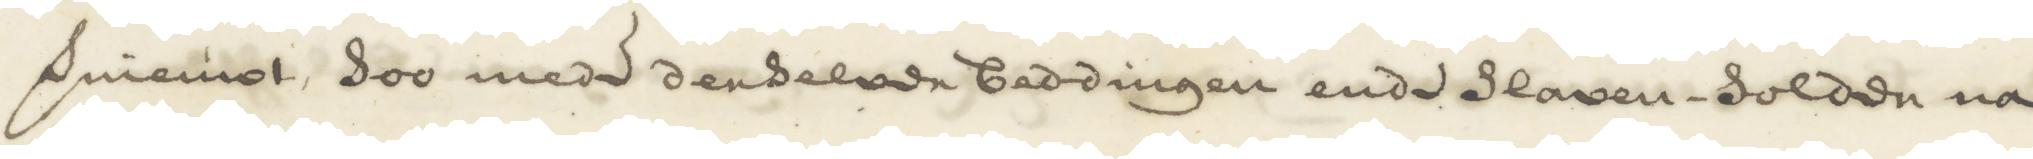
vernieuwt, Soo mede derselver beddingen ende Slaven-Solder na
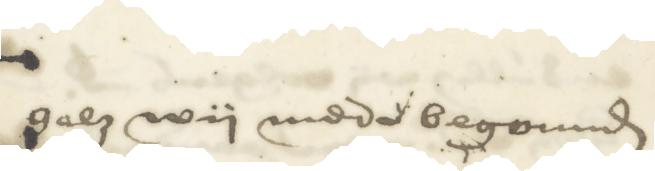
g als wij mede begonnen
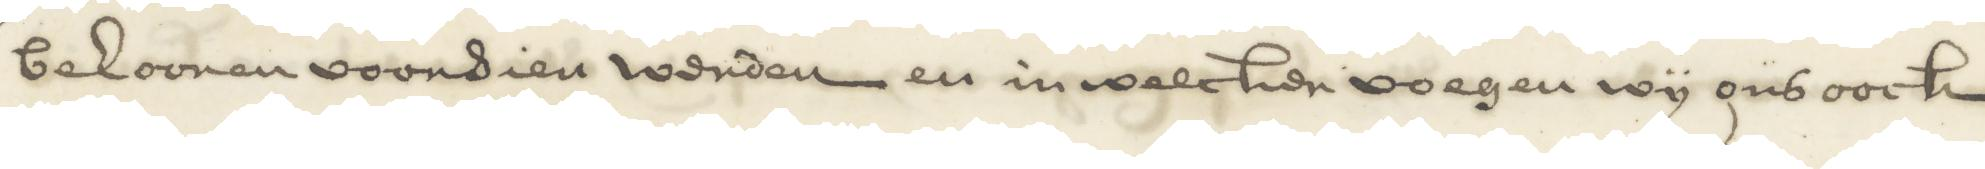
behooren voorsien werden en in welcker voegen wij ons oock
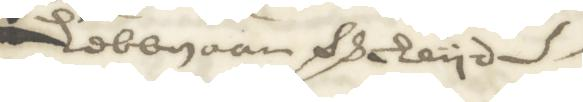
hebben aan verscheijde
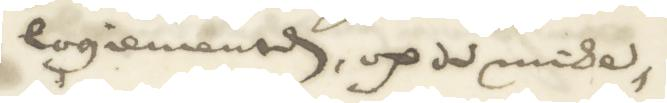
logiementen, op de mise„
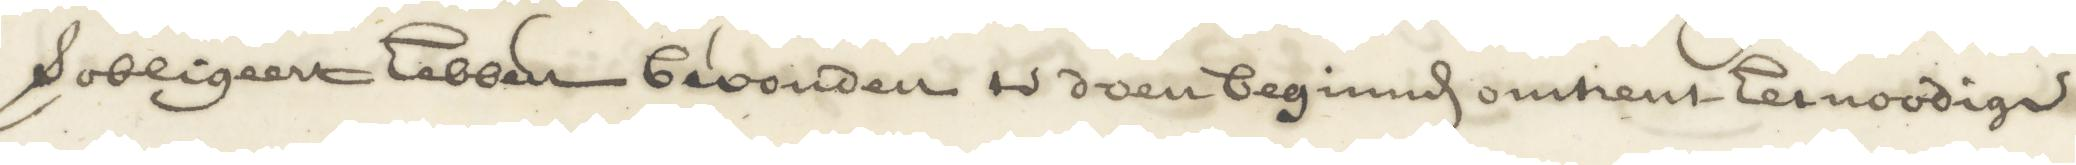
verobligeert hebben bevonden te doen beginnen omtrent het noodige
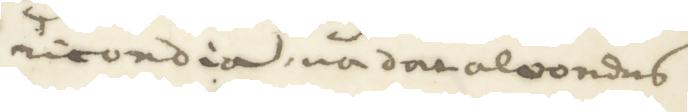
ricordia, na dat alvorens
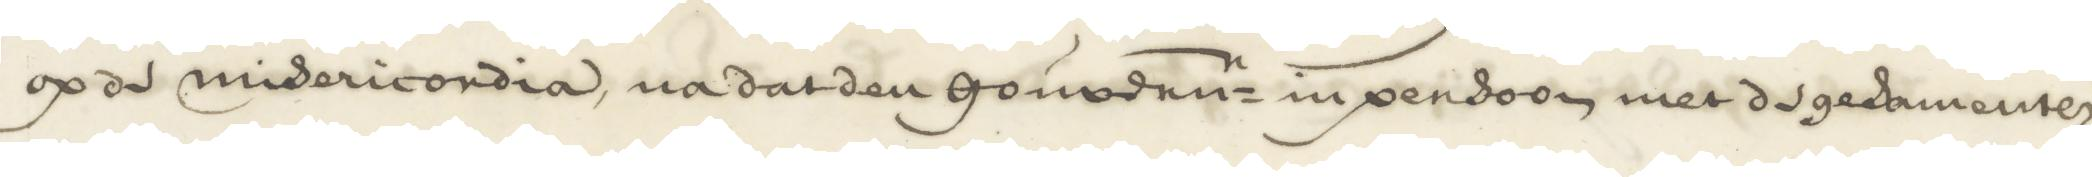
op de misericordia, na dat den gouvern= in persoon met de gesamentlijke
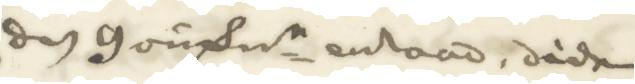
den gouvern=r en raad, dier
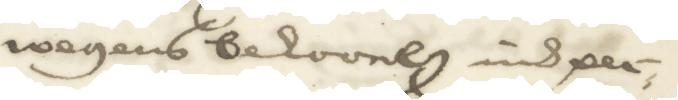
wegens behoorlijke in spec„
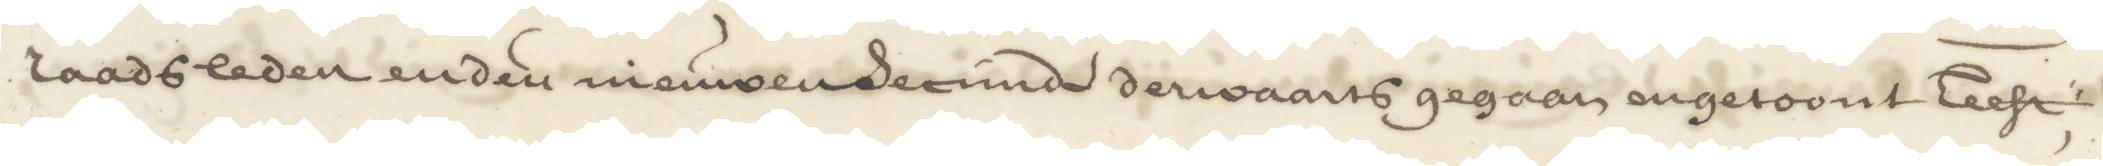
raadsleden en den nieuwen Secunde derwaarts gegaan en getoont heeft
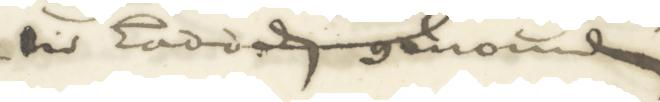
„tie hadden genomen
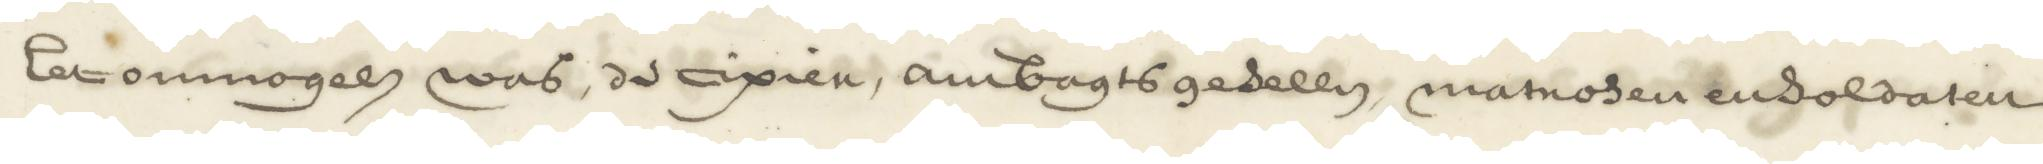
het onmogelijk was, de cipier, ambagtsgesellen, matrosen en soldaten
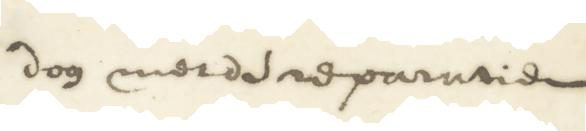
dog met de reparatie
